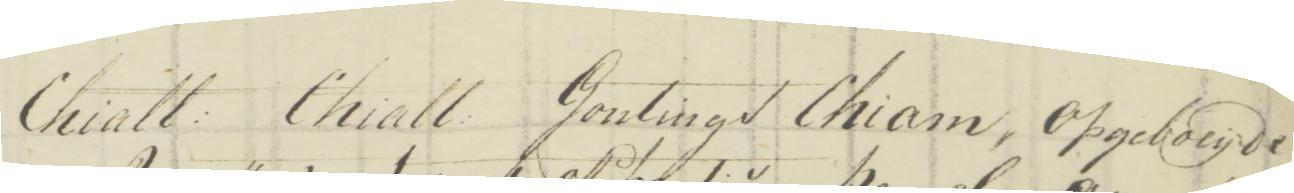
Chiall. Chiall. Gontings Chiam, op geboeijde
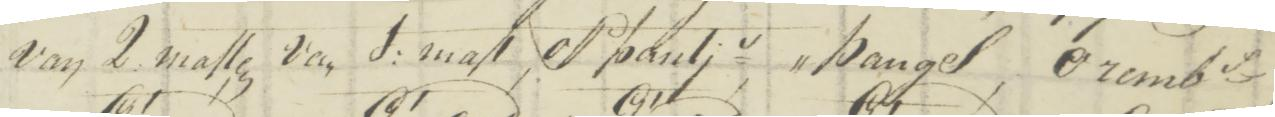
van 2. masten van 1: mast Ppantj=s „ Pangs Oremb=s
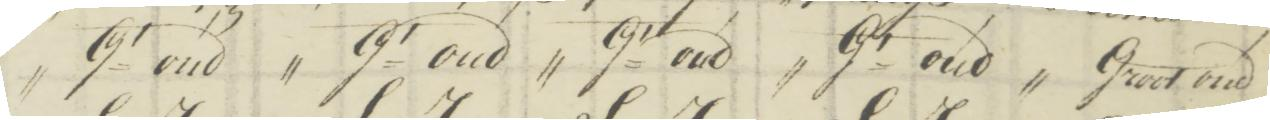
„ G=t oud „ G=t oud „ G=t oud „ G=t oud „ Groot oud
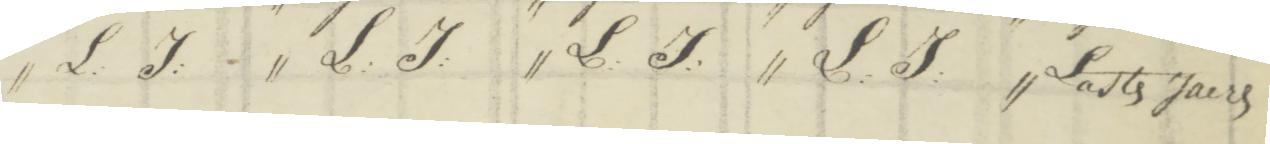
„ L: J: „ L: J: „ L: J: „ L: J: „ Lasten Jaeren
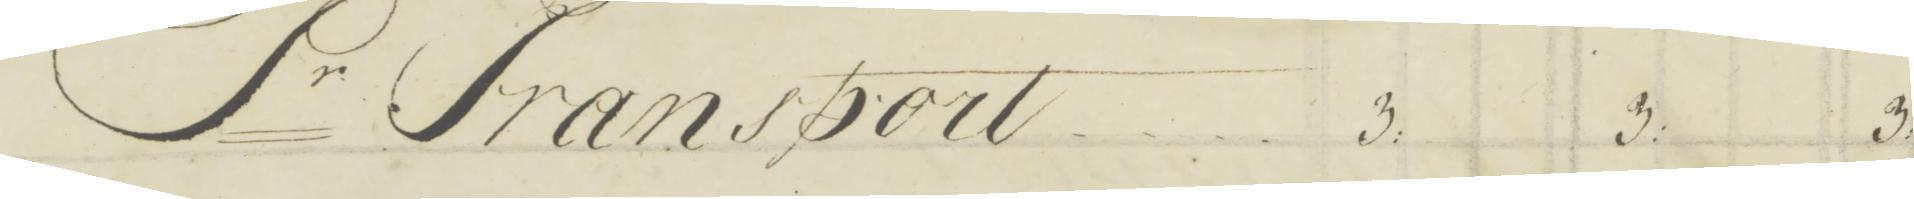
P=r Transport . . . . 3: 3: 3:
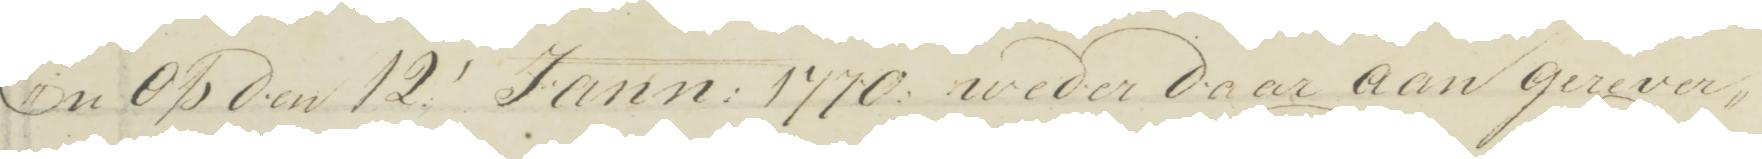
En op den 12:' Iann: 1770: weder daar aan gerever„
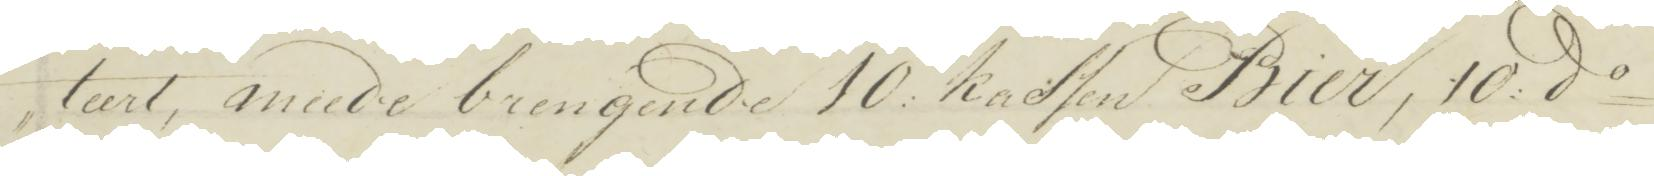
„teert, meede brengende 10: kassen Bier, 10: d=o
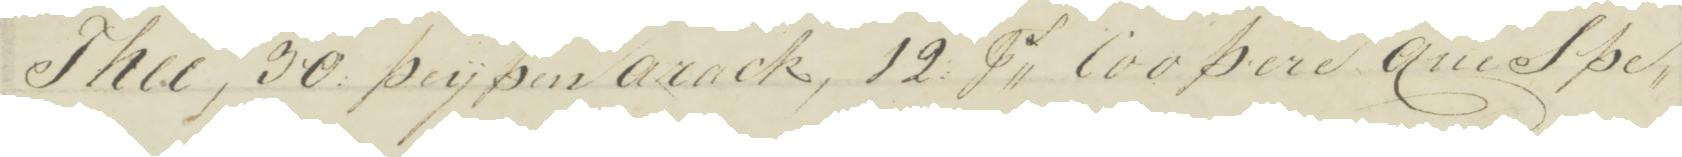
Thee, 30: peijpen arack, 12: p„s Coopere quespe„
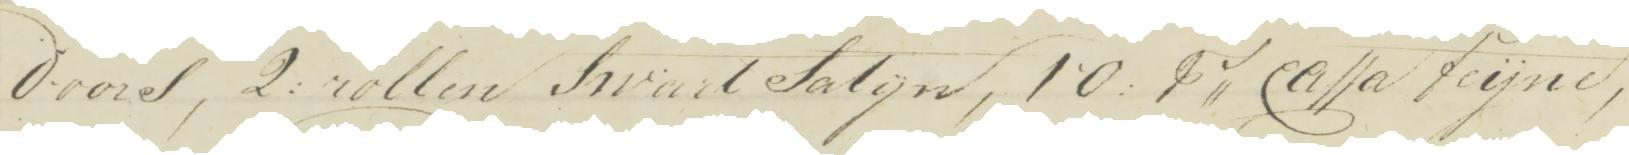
doors, 2: rollen Swart Satijn, 10: p„s Cassa feijne,
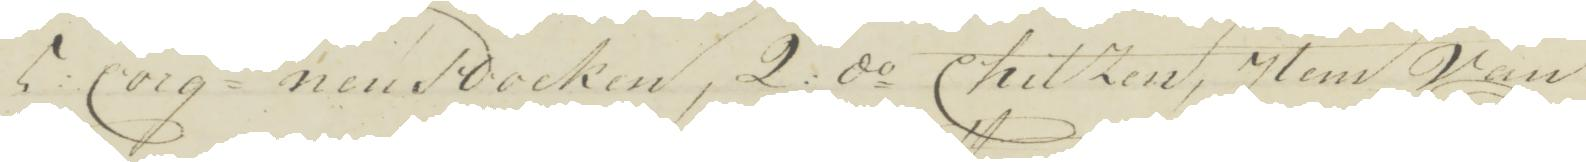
5: Corg=s neusdoeken, 2: d=o Chitzen, Jtem Van
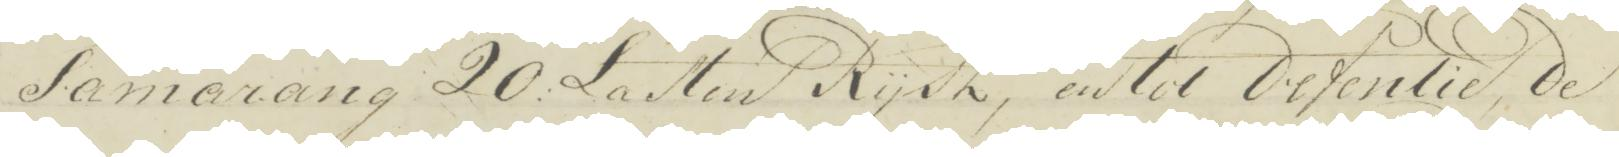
Samarang 20: Lasten Rijst, en tot defentie, de
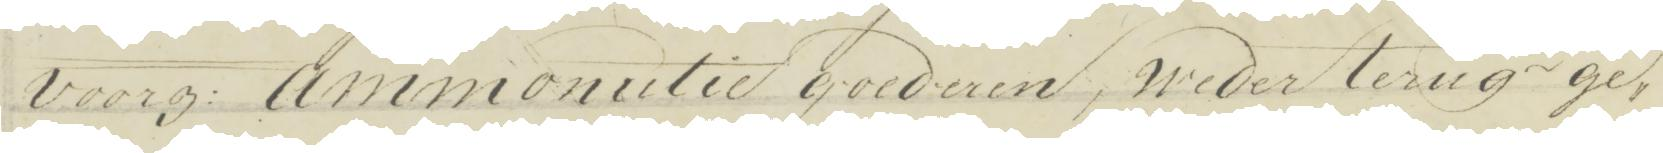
voorz: ammonutie goederen, weder terug ge
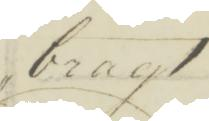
„bragt.
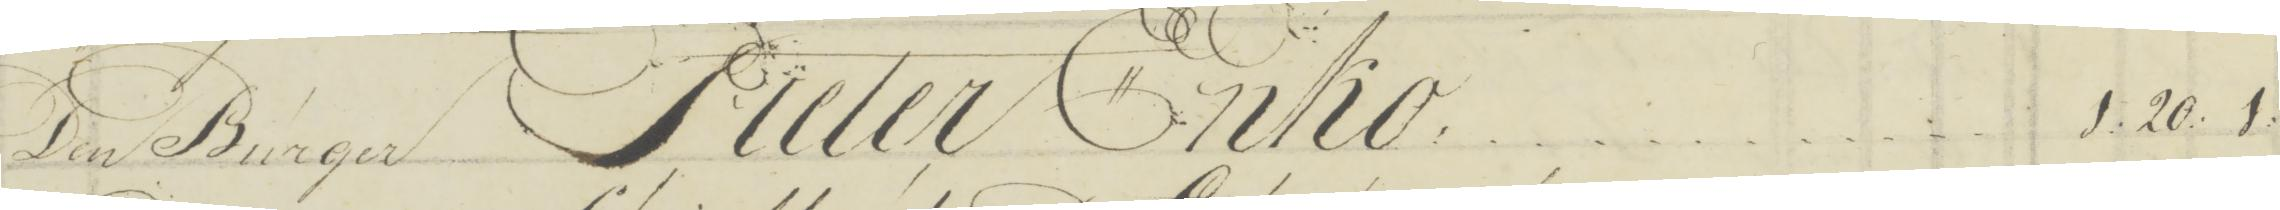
Den Burger Pieter Enko: . . . . . . . . . . . . . 1: 20:1:
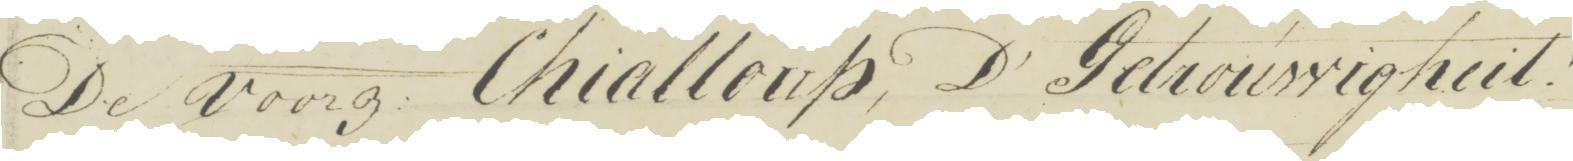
De voorz: Chialloup, D' Getrouwigheit:
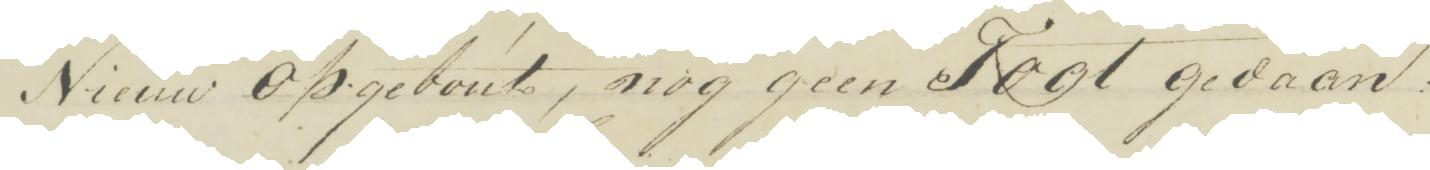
Nieuw opgebout, nog geen Togt gedaan:
